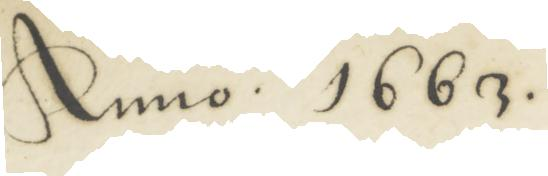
Anno. 1663.
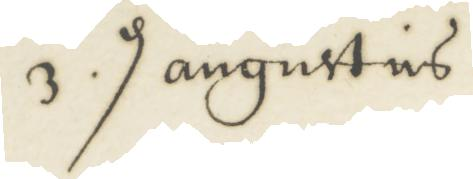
3.en augustus
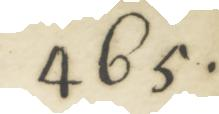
465.
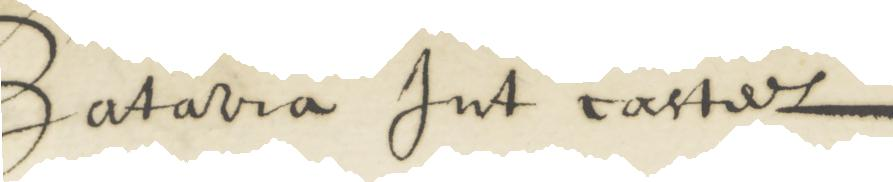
Batavia jnt casteel
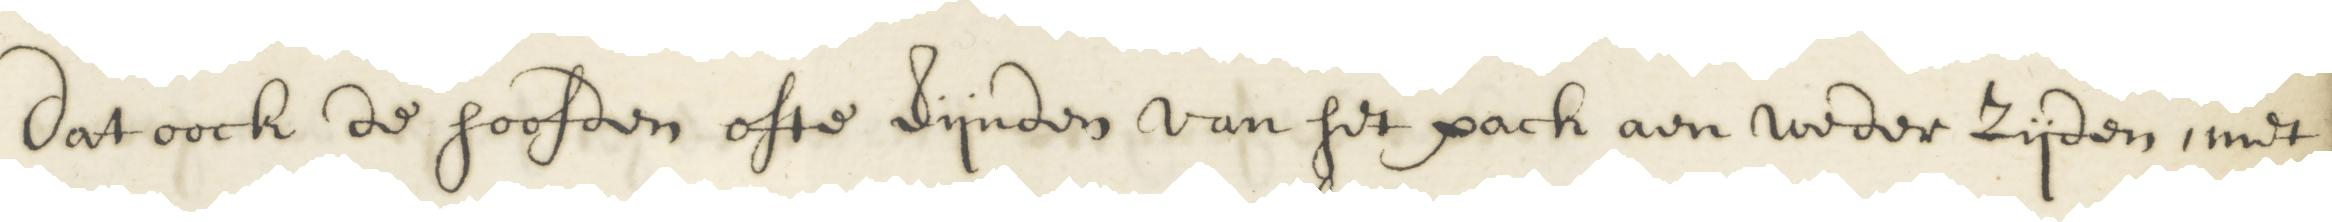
dat oock de hoofden ofte Eijnden van het pack aen weder zijden, met
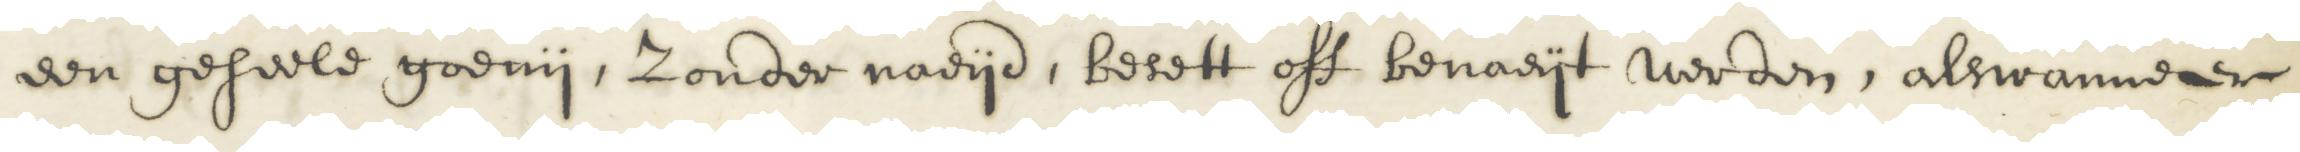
een geheele goenij, zonder naeijd, besett off benaeijt werden, als wanneer
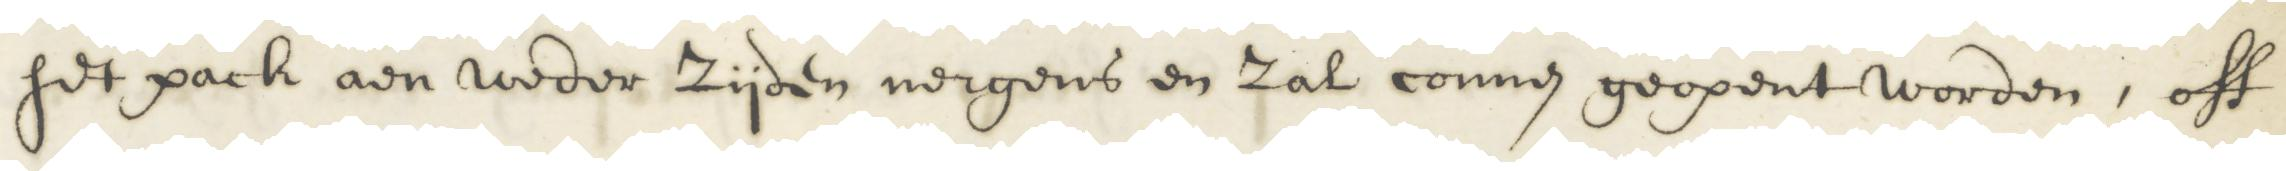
het pack aen weder zijden nergens en zal connen geopent worden, off
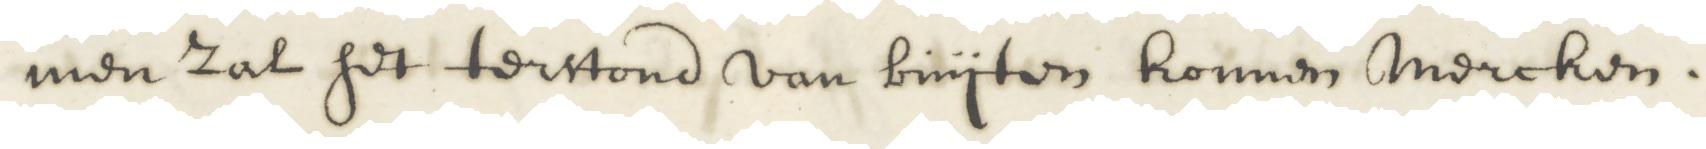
men zal het terstond van buijten konnen mercken.
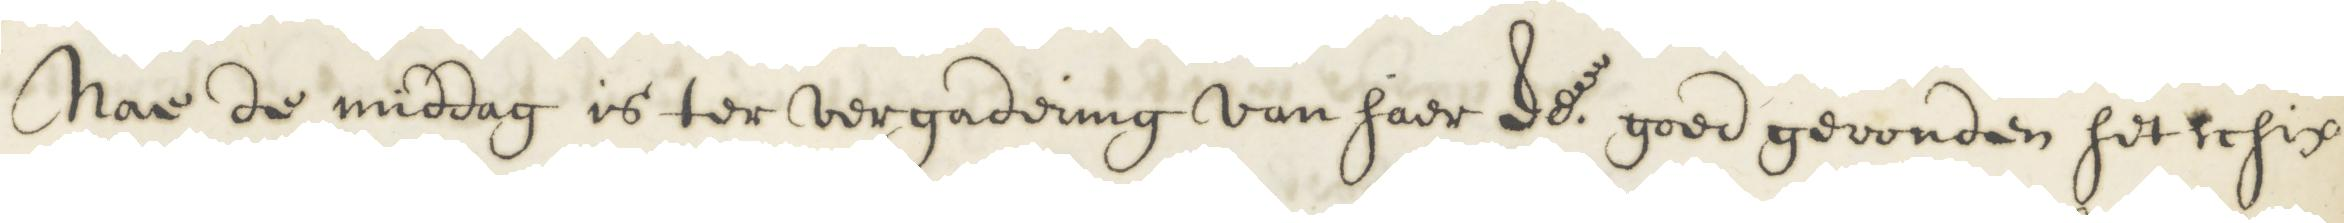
Nae de middag is ter vergadering van haer Ed.e goed gevonden het schip
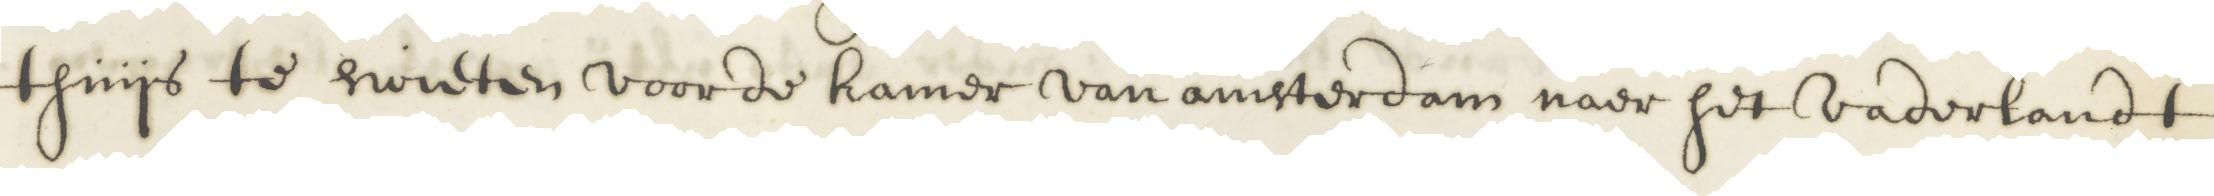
thuijs te swieten voor de kamer van amsterdam naer het vaderlandt
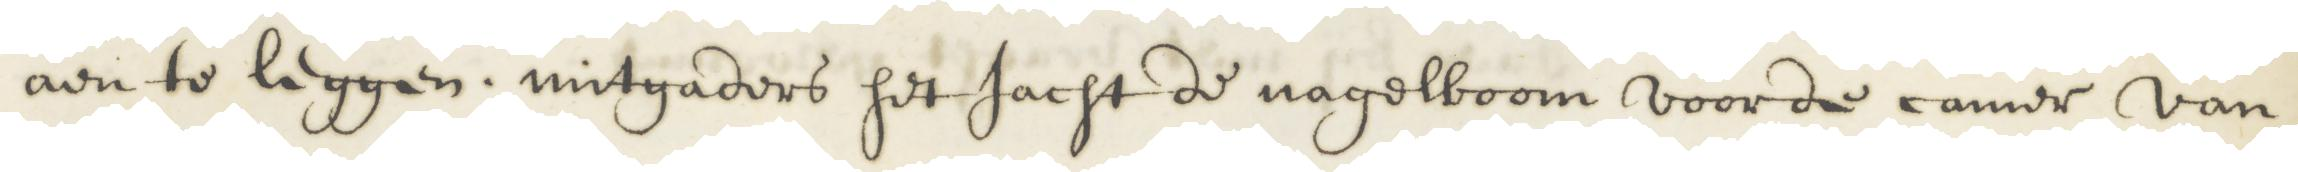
aen te leggen. mitgaders het jacht de nagelboom voor de camer van
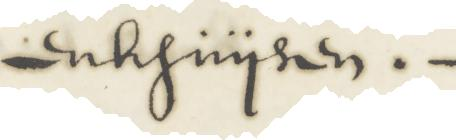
enkhuijsen.—
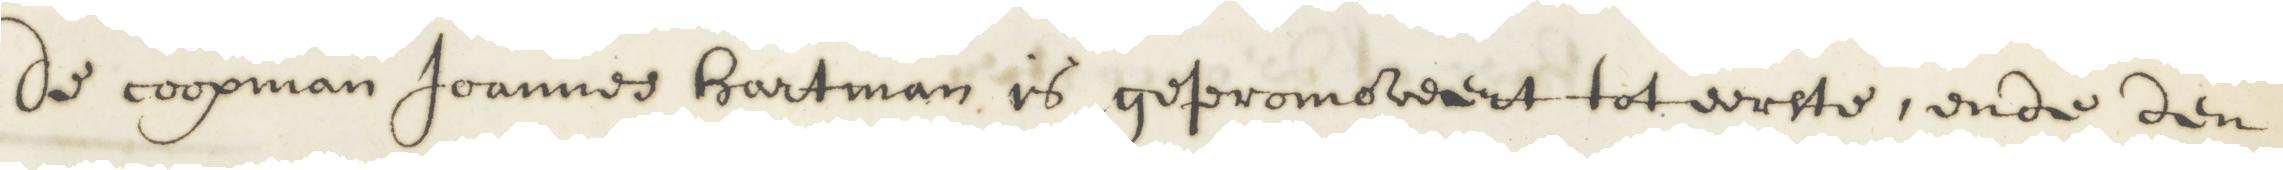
de coopman Joannes Hartman is gepromoveert tot eerste, ende den
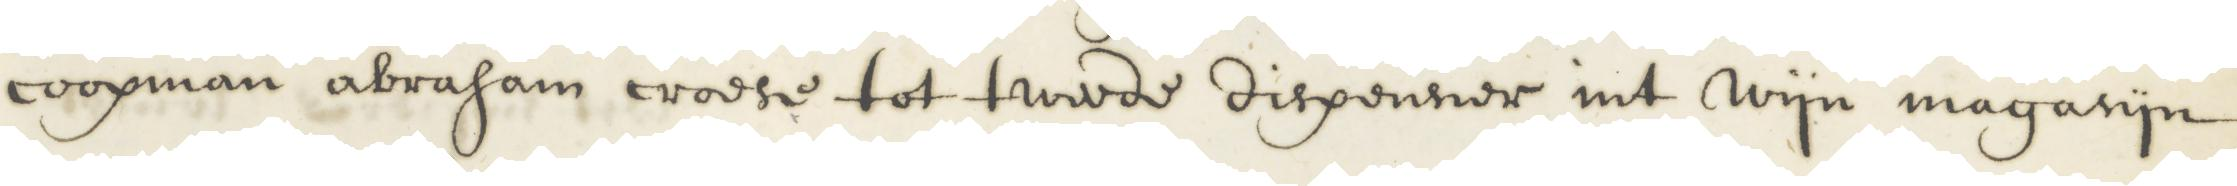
coopman abraham croese tot tweede dispensier int wijn magasijn
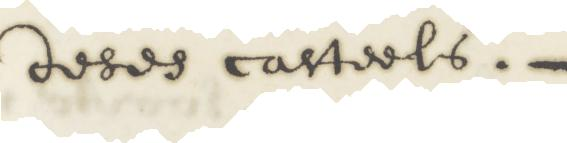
deses casteels. —
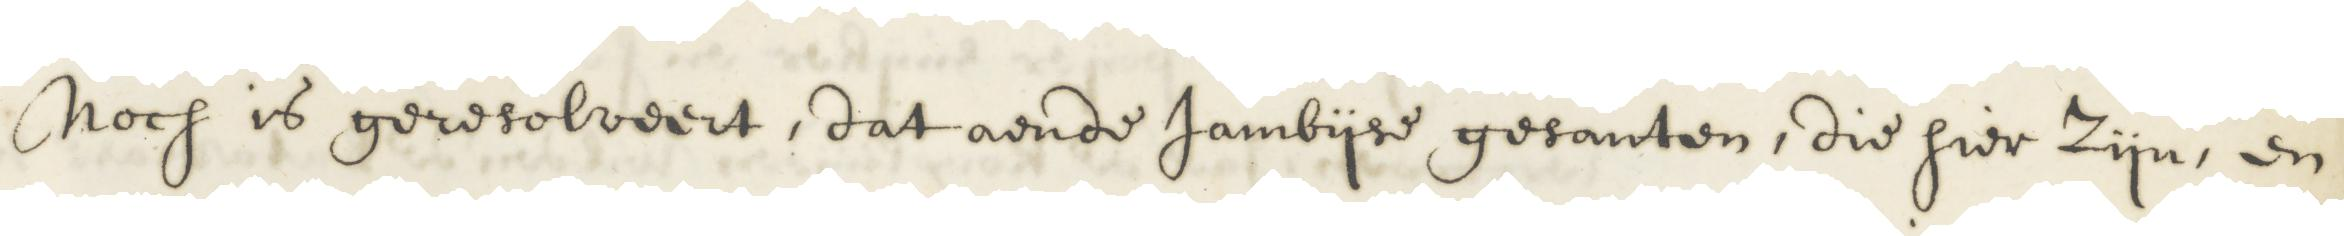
Noch is geresolveert, dat aende jambijse gesanten, die hier zijn, en
